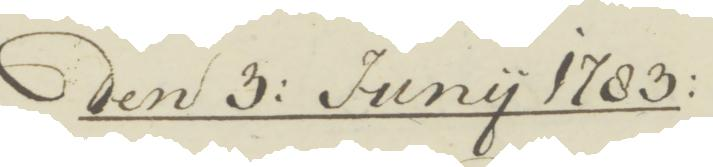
den 3: Junij 1783:
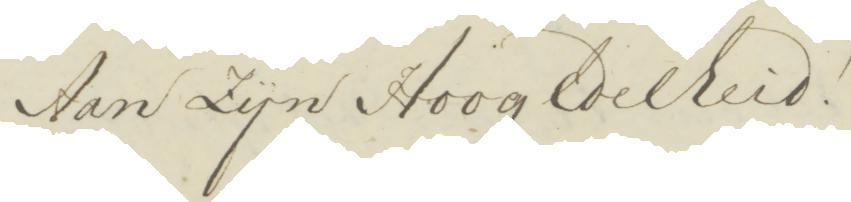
Aan zijn Hoog Edelheid!
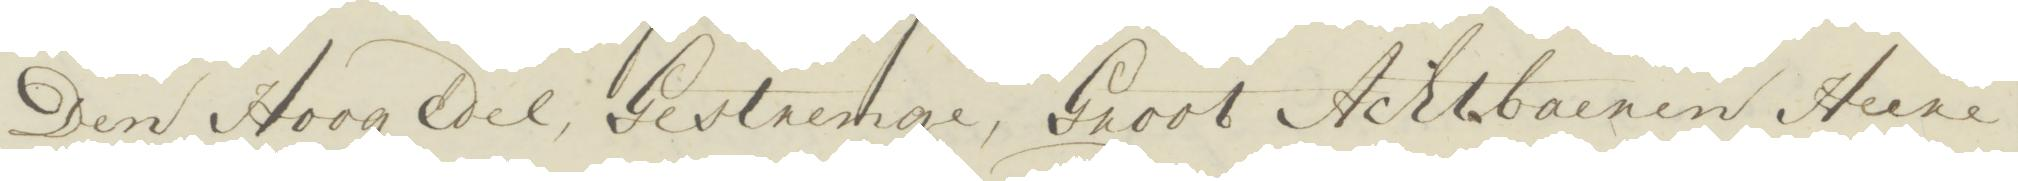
Den Hoog Edel, Gestrenge, Groot Achtbaeren Heere
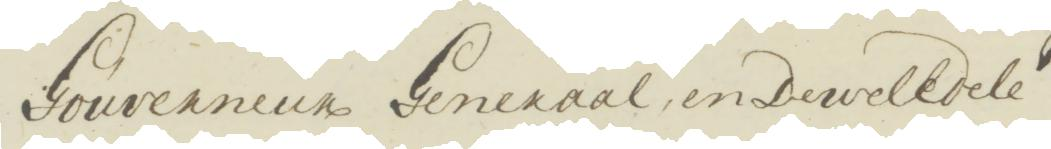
Gouverneur Generaal, en DewelEdele
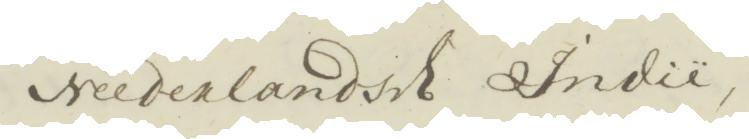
Neederlandsch Jndië,
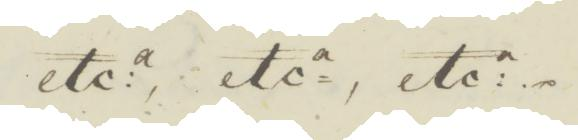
etc:a, etc=a, etc:a.
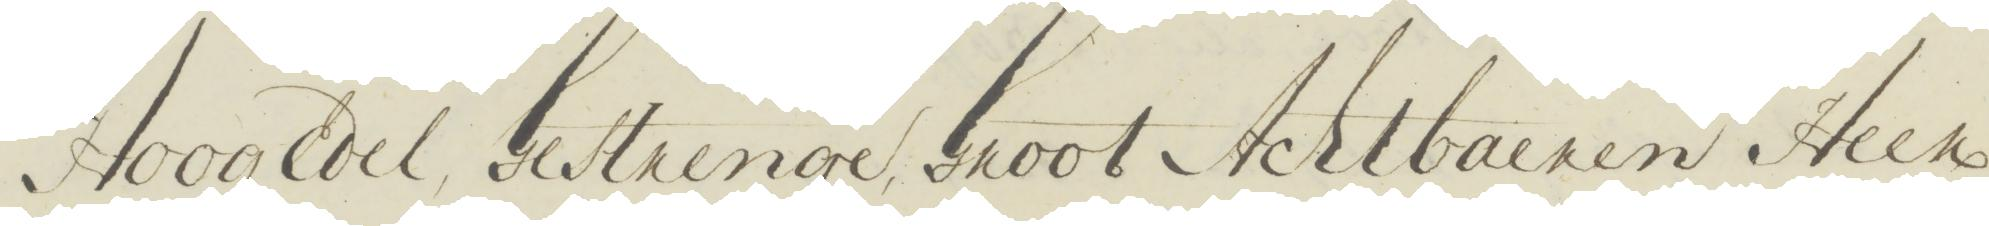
Hoog Edel, Gestrenge, Groot Achtbaeren Heer
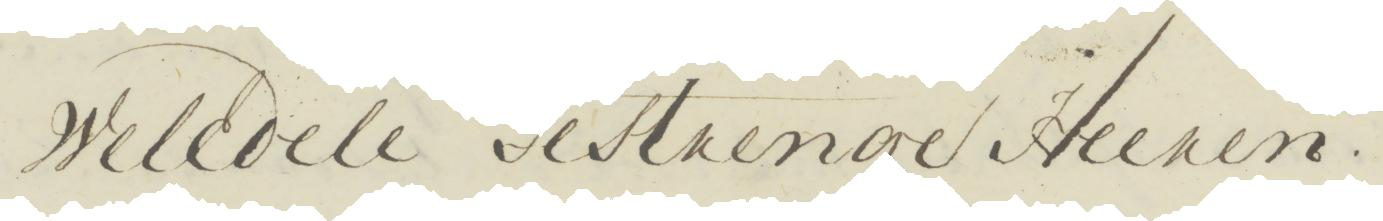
WelEdele Gestrenge Heeren!
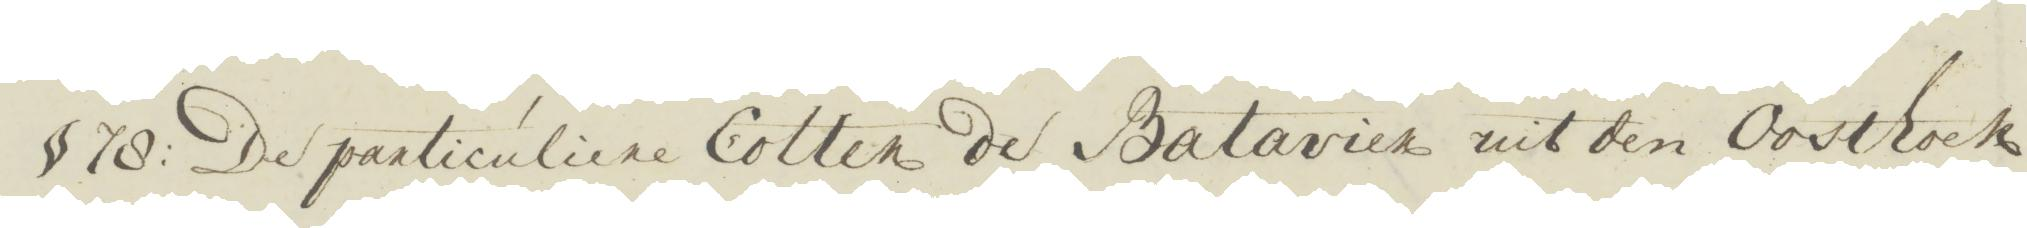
§ 78: De particuliere Cotter de Batavier uit den Oosthoek
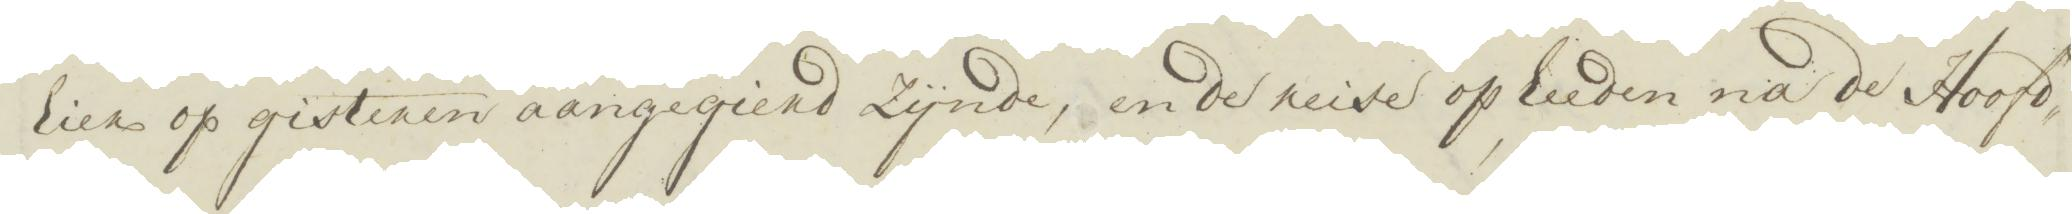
hier op gisteren aangegierd zijnde, en de reise op heeden na de Hoofd„
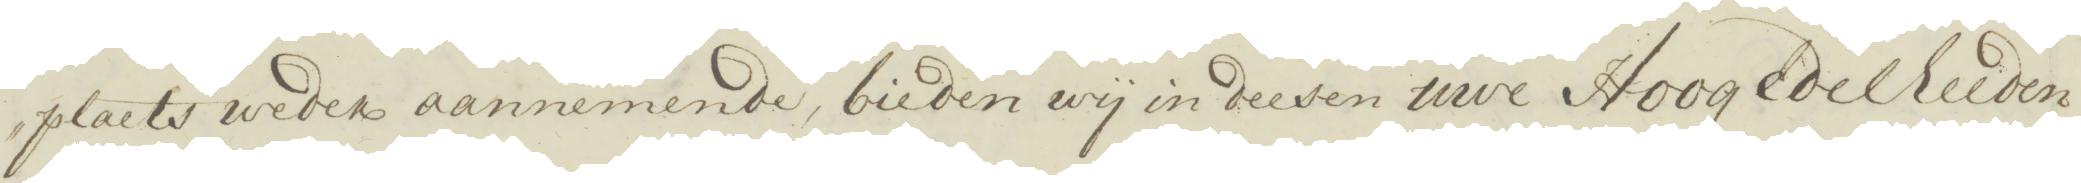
„plaets weder aannemende, bieden wij in deesen uwe Hoog Edelheeden
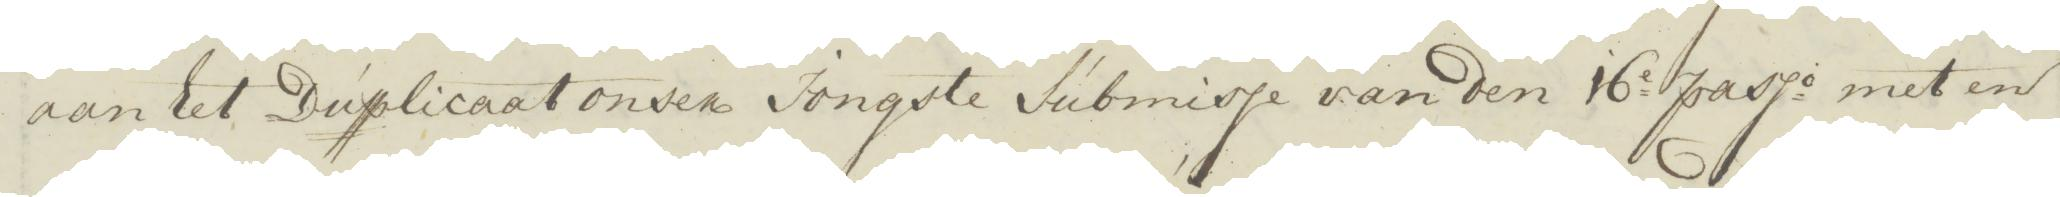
aan het Dupplicaat onser Jongste submisse van den 16=e pass=o met en
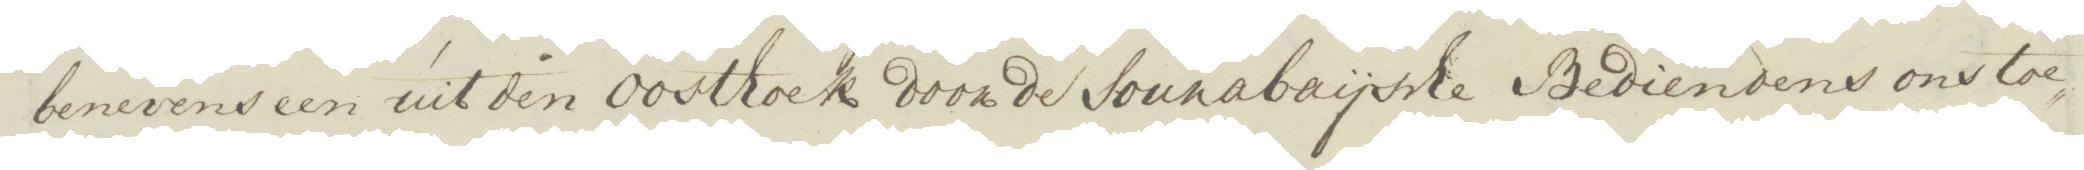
benevens een uit den oosthoek door de sourabaijsche Bediendens ons toe„
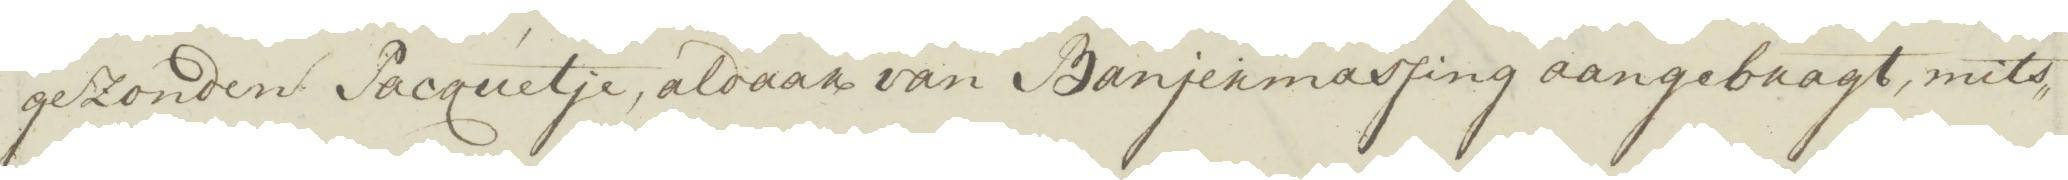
gezonden Pacquetje, aldaar van Banjermassing aangebragt, mits„
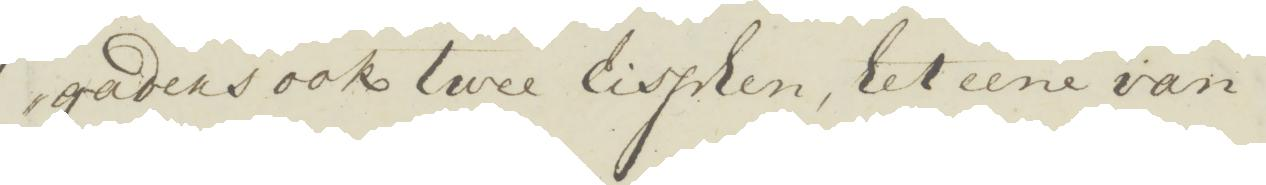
„gaders ook twee Eisschen, het eene van
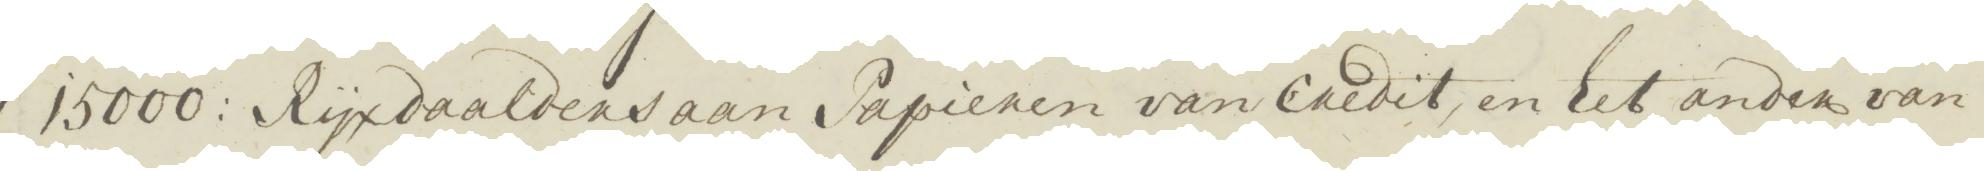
15000: Rijxdaalders aan Papieren van credit, en het ander van
